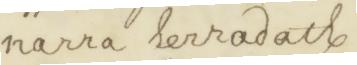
narra herradath
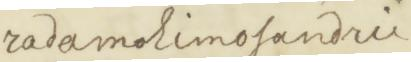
radamohimojandrie
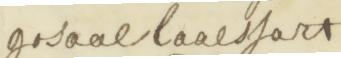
gosaallaalsjart
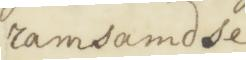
ramsamdse
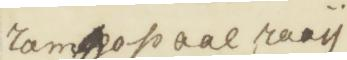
ramjopaal raaij
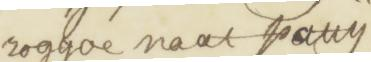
roggoe naat pattij
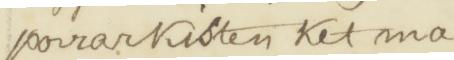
porarkisten ket ma
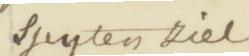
spyten ziel
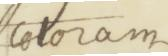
cotoram
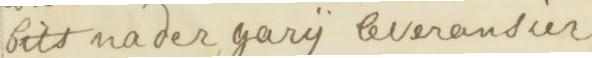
bits na der garij leveransier
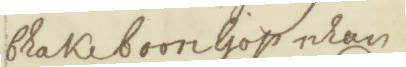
bhakeboon Gop nhan
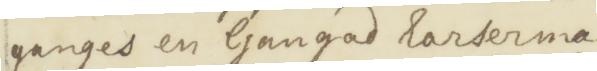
ganges en Gangad harserma
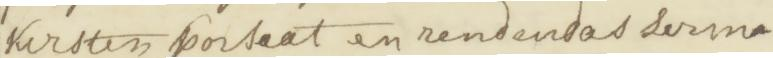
kirsten porsaat en rendendas serma
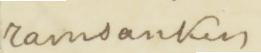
ramsankin
